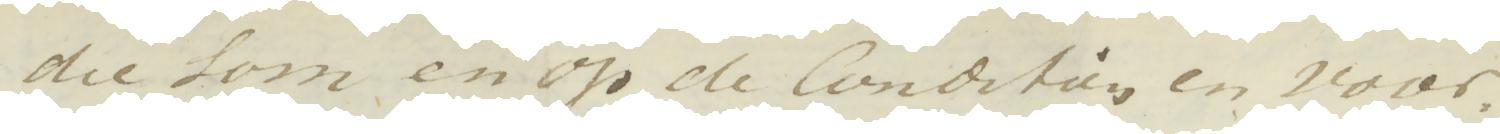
die Som en op de Conditien en voor„
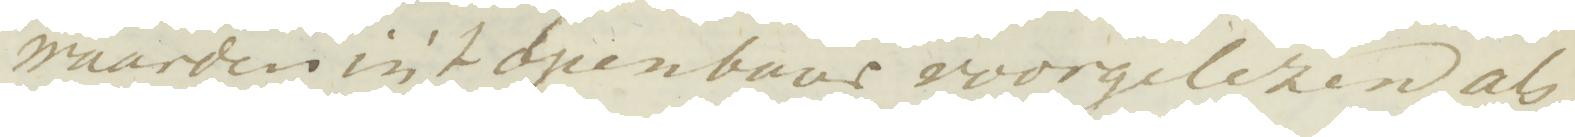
waarden in't openbaar voorgelezen, als
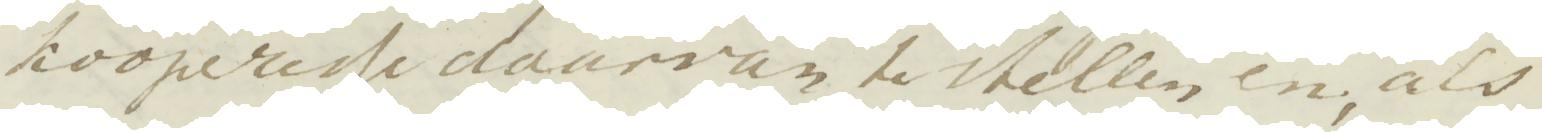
kooperesse daarvan te stellen en, als
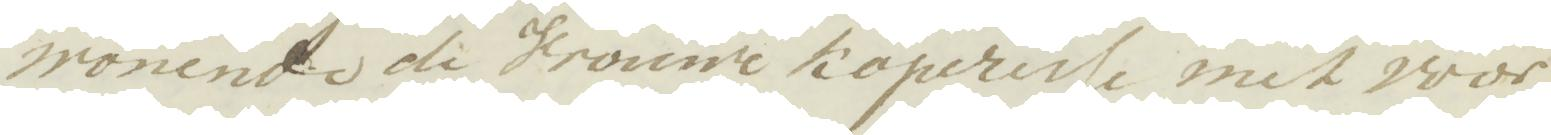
wonende de Vrouwe Koperesse met voor
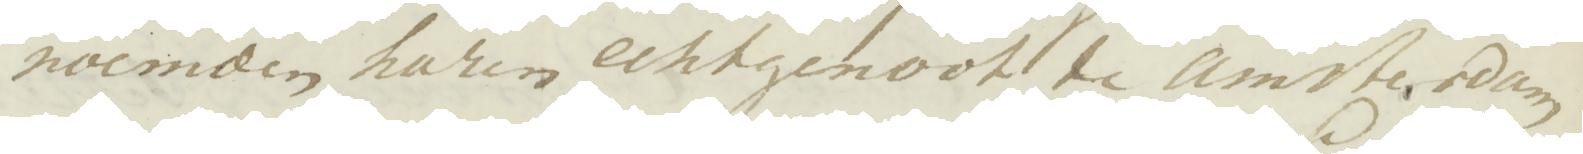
noemden haren echtgenoot te Amsterdam
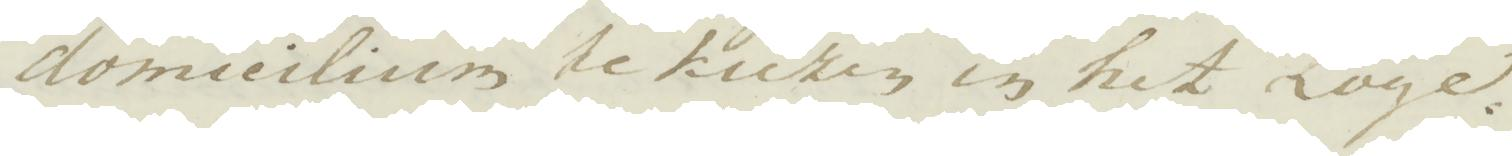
domicilium te kiezen in het Loge„
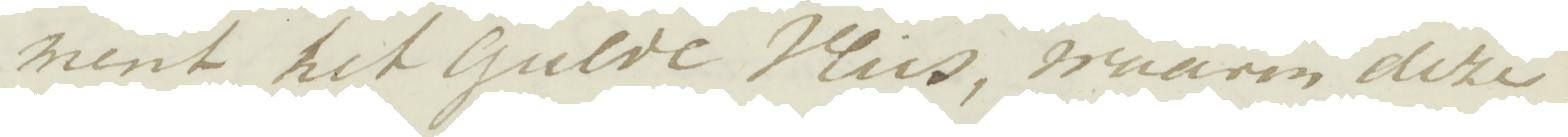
ment het Gulde Vlies, waarin deze
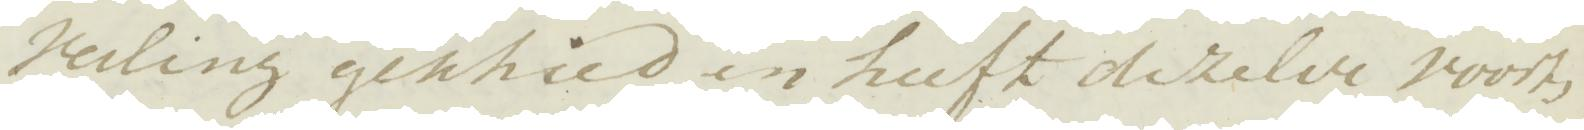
Veiling geschied en heeft dezelve voorts
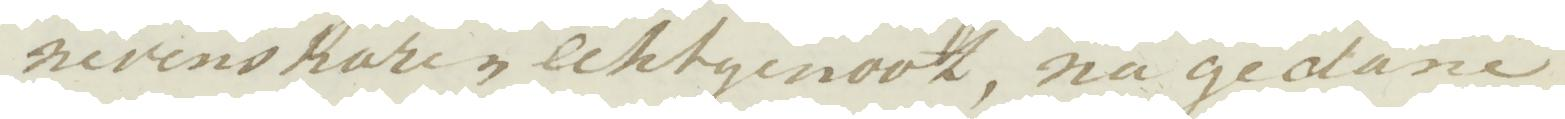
nevens haren echtgenoot, na gedane
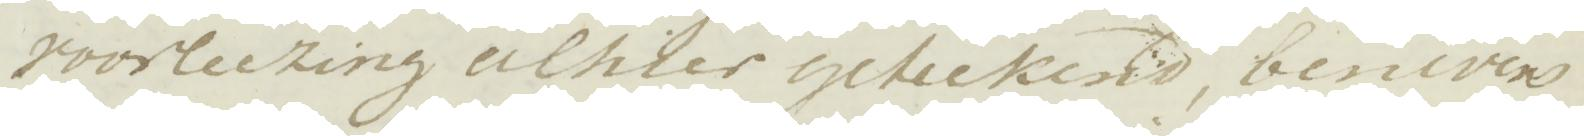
voorleezing alhier geteekend, benevens
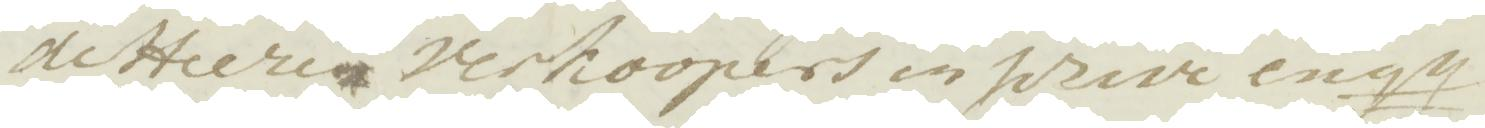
de Heeren verkoopers in prive engg
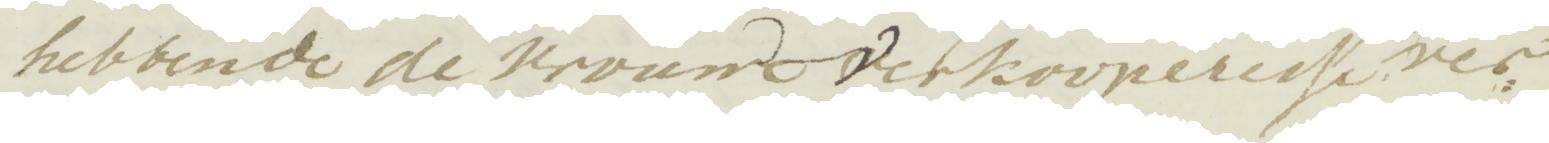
hebbende de Vrouwe Verkooperesse ver„
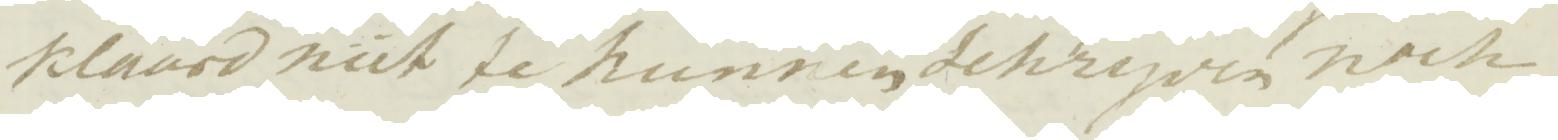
klaard niet te kunnen schryven noch
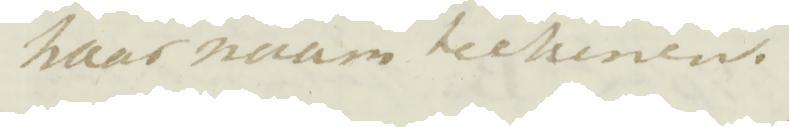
haar naam teekenen.
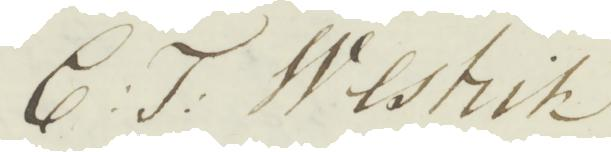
C: T: Westrik
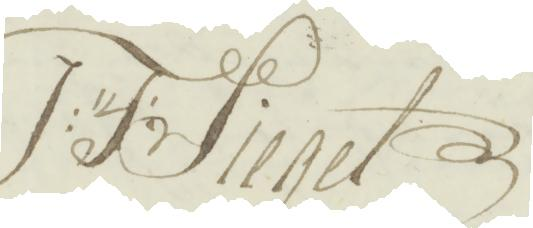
J: F: Siegel
